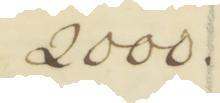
2000.
